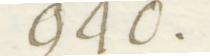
940.
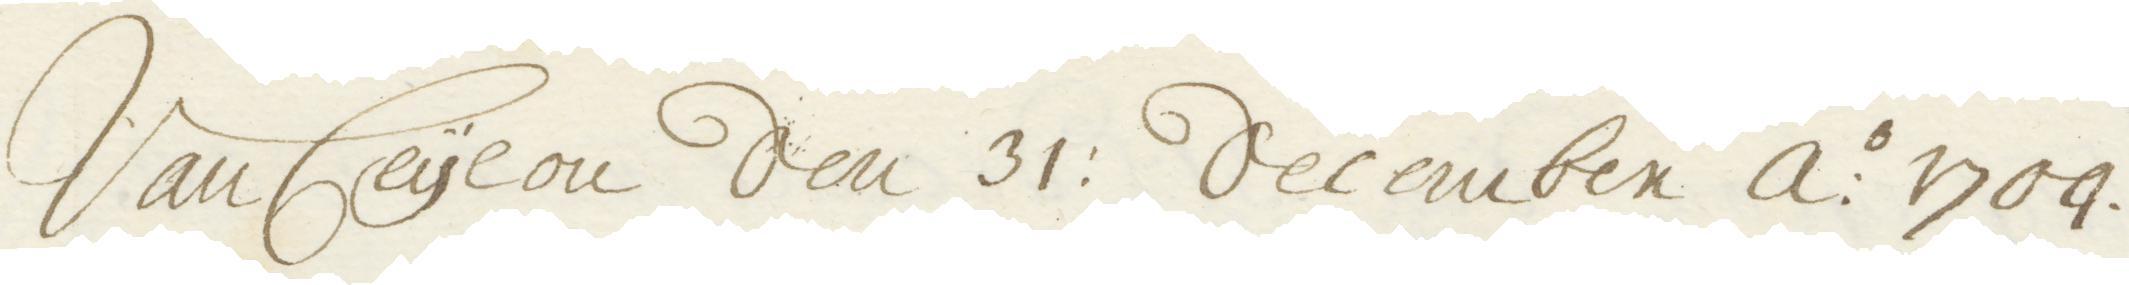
Van Ceijlon den 31: december A:o 1704.
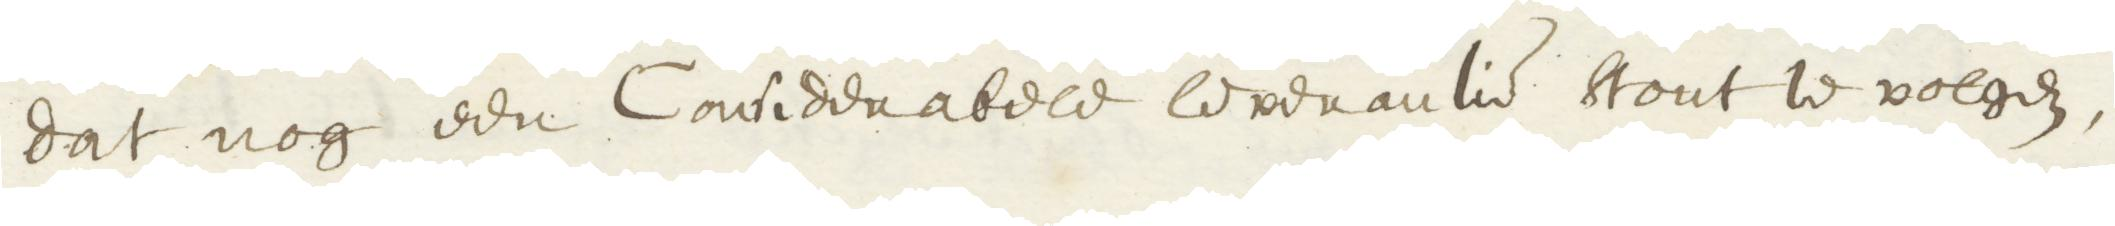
dat nog een Considerabele leverantie stont te volgen,
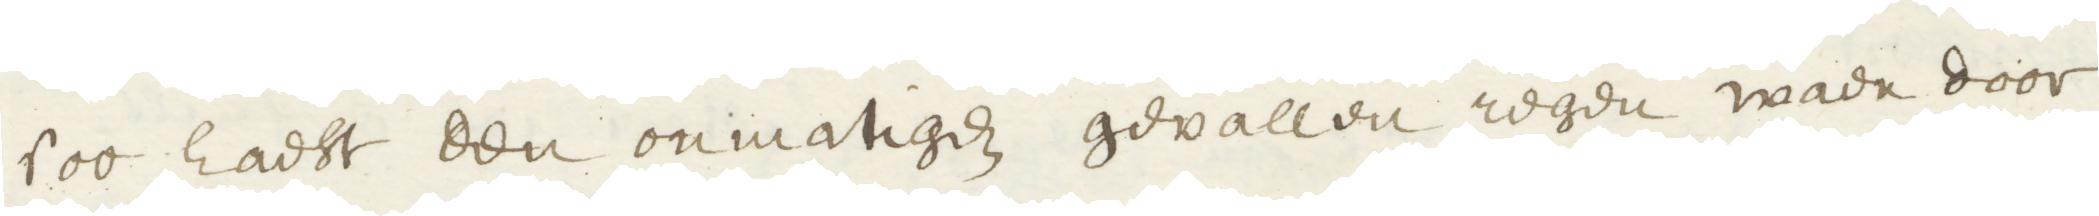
soo haeft den onmatigen gevallen regen waer door
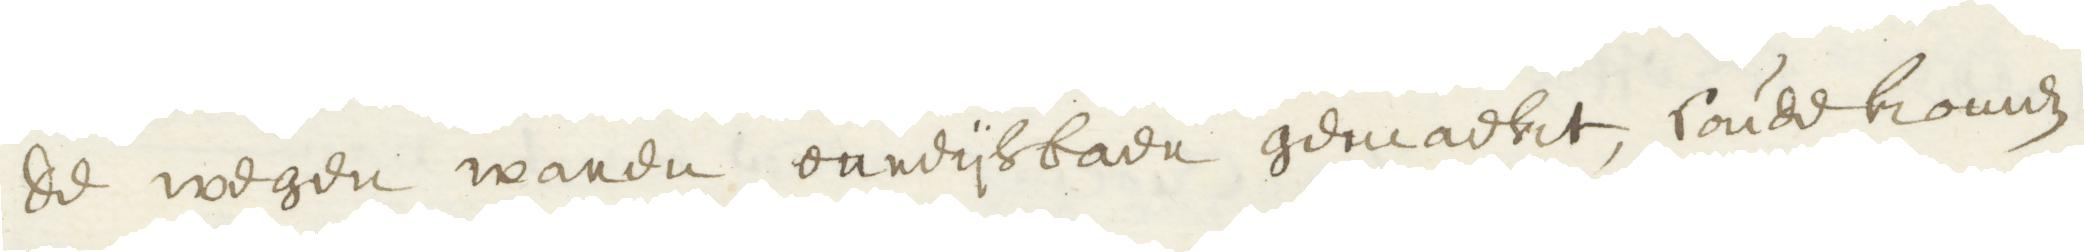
de wegen waren onreijsbaer gemaekt, soude komen
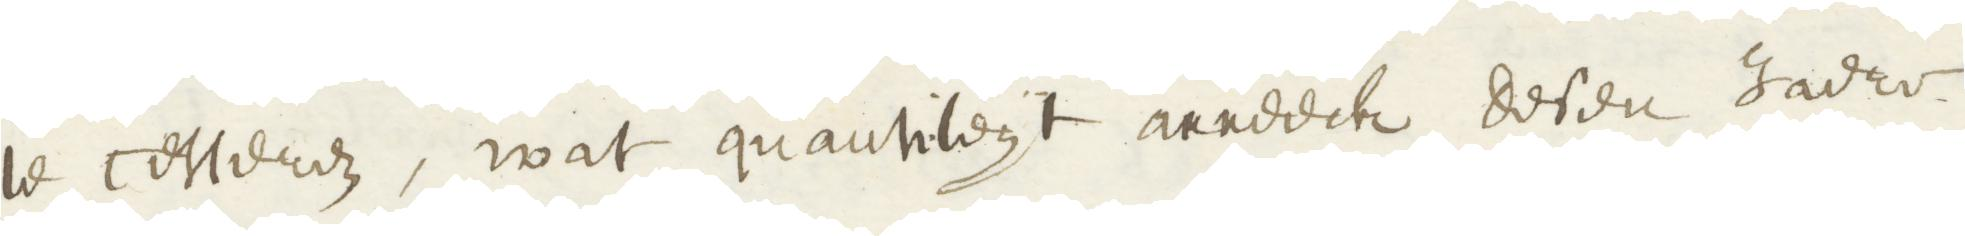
te cesseren, wat quantiteijt arreeck desen Iaere
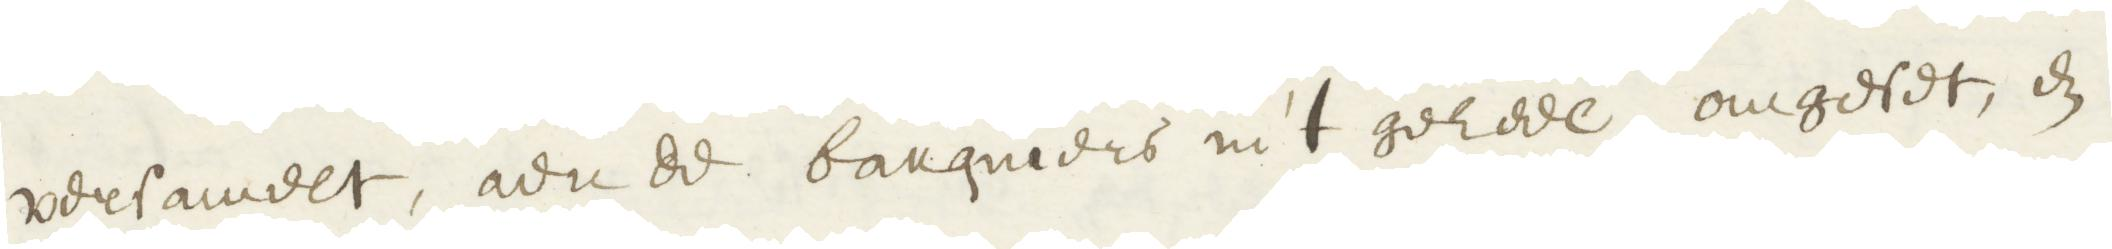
versamelt, aen de barquiers in ’t geheel omgeset, en
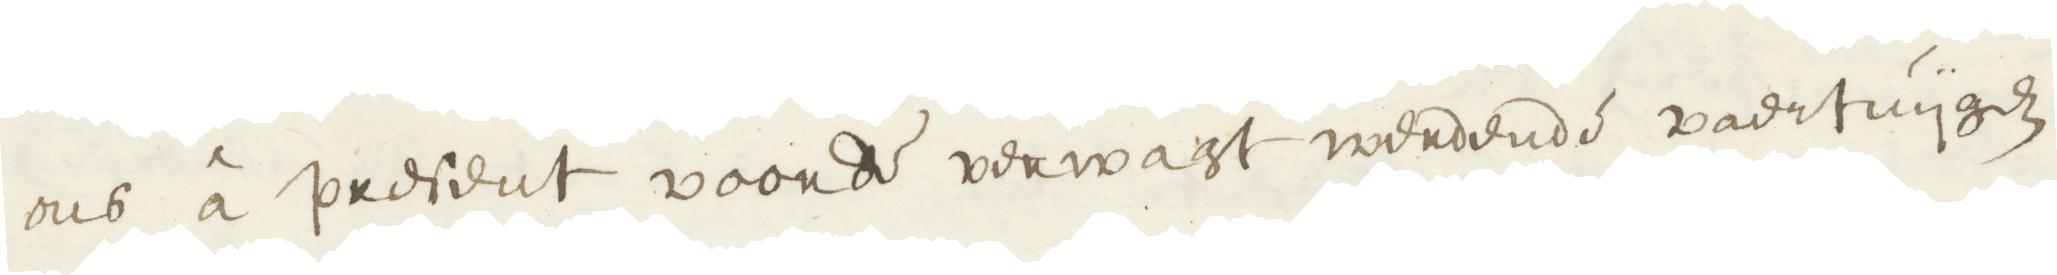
ons â present voor de verwast werdende vaertuijgen
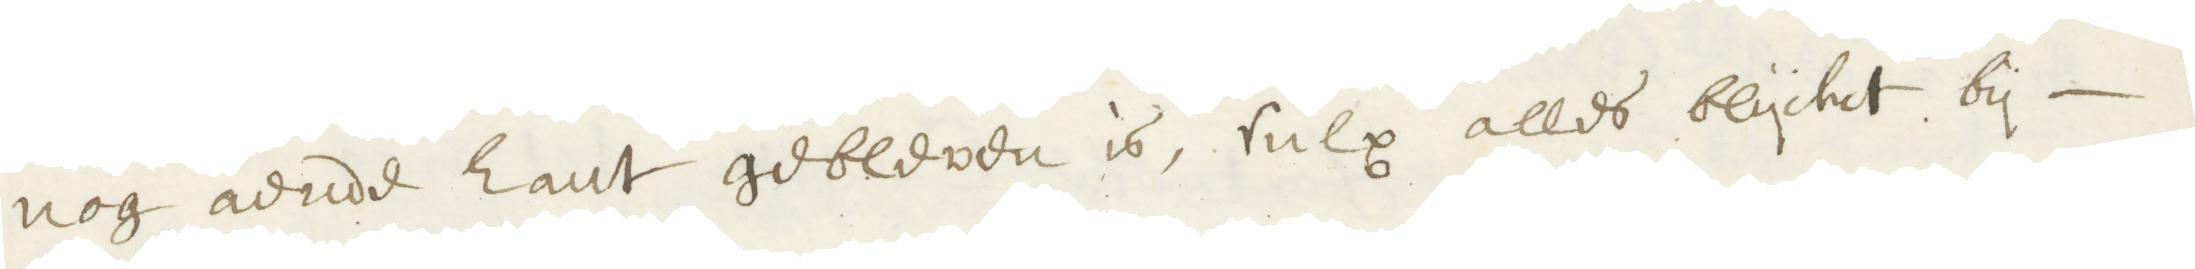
nog aende hant gebleven is, sulx alles blijckt bij —
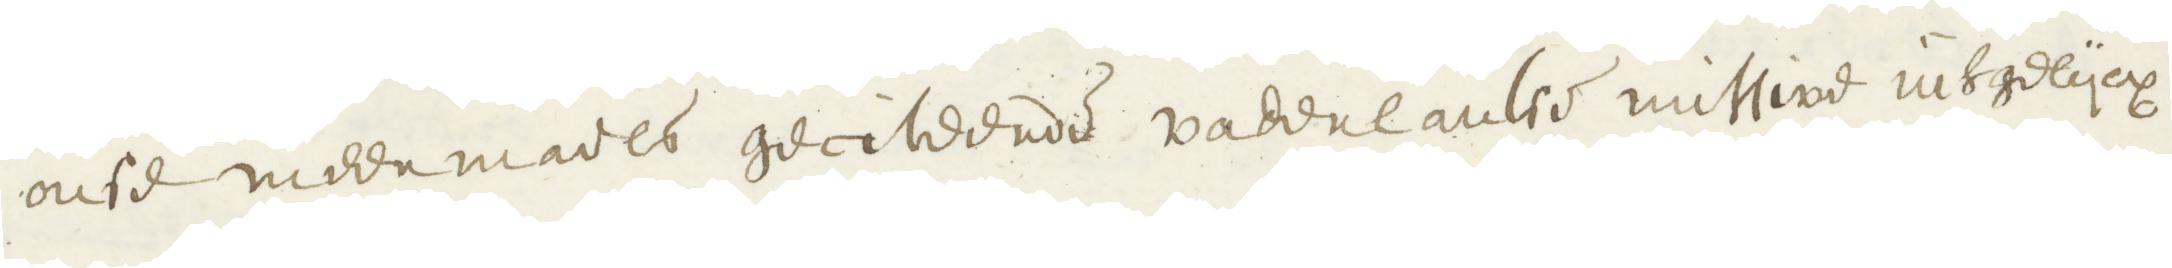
onse meermaels geciteerde vaderlantse missive insgelijcx
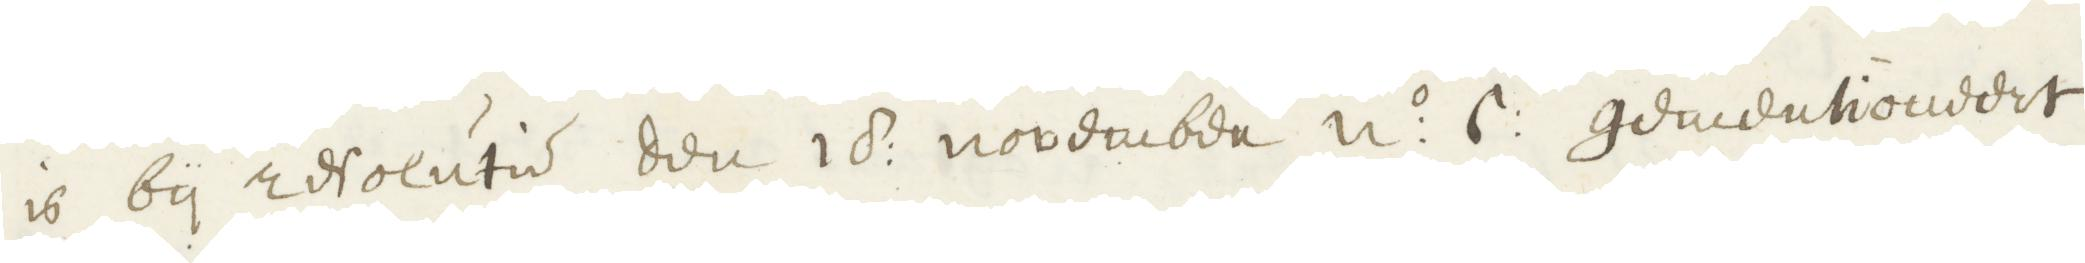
is bij resolutie den 18: november n:o 5: gementioneert
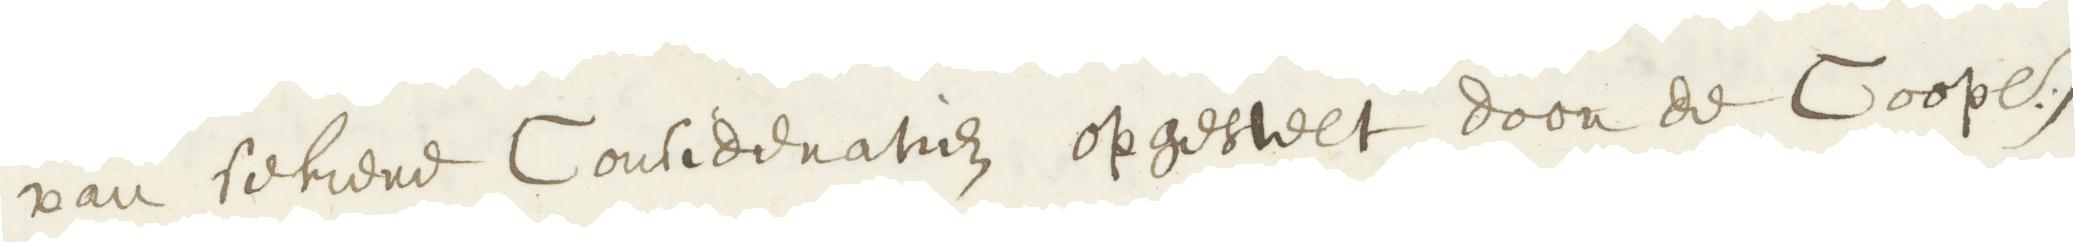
van sekere Consideratien opgestelt door de Cooplijk
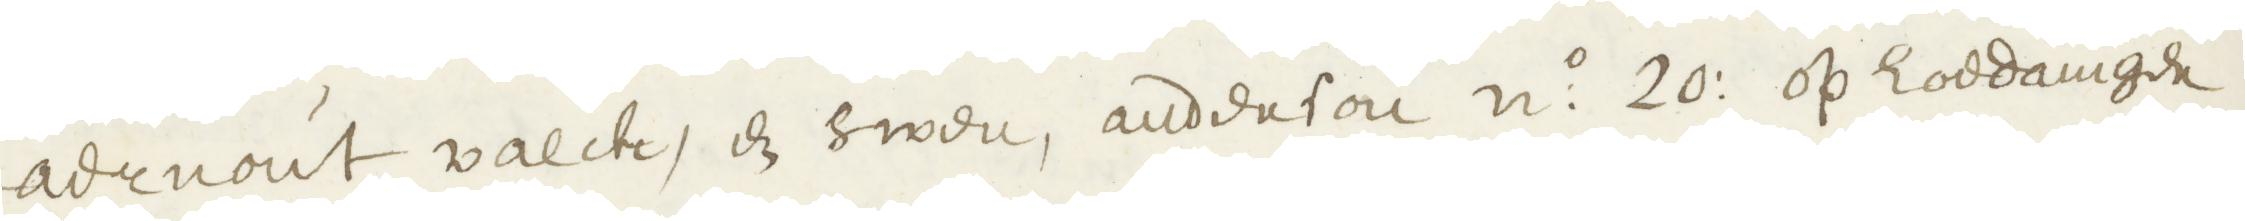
aernout valck, en swen, anderson n:o 20: op hoedaniger
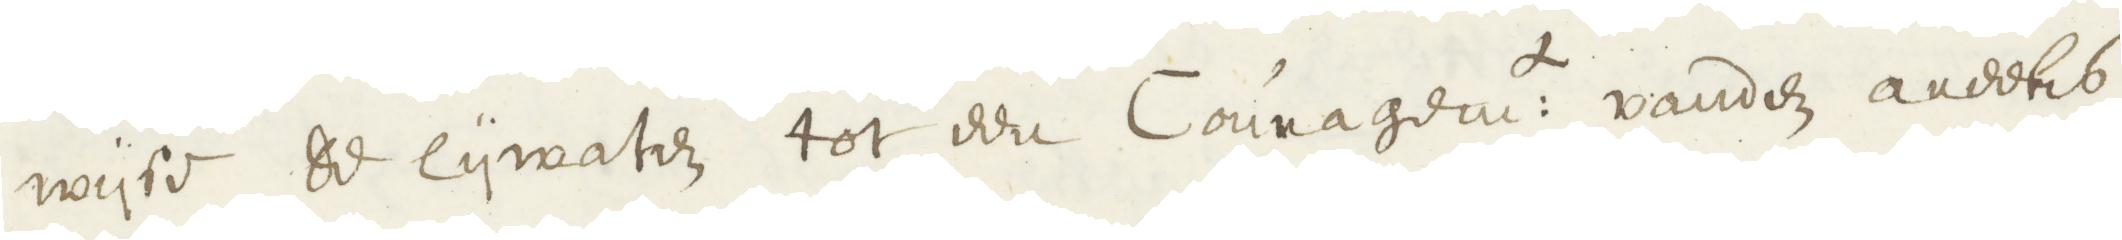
wijse de lijwaten tot een Couragem:t vanden areeks
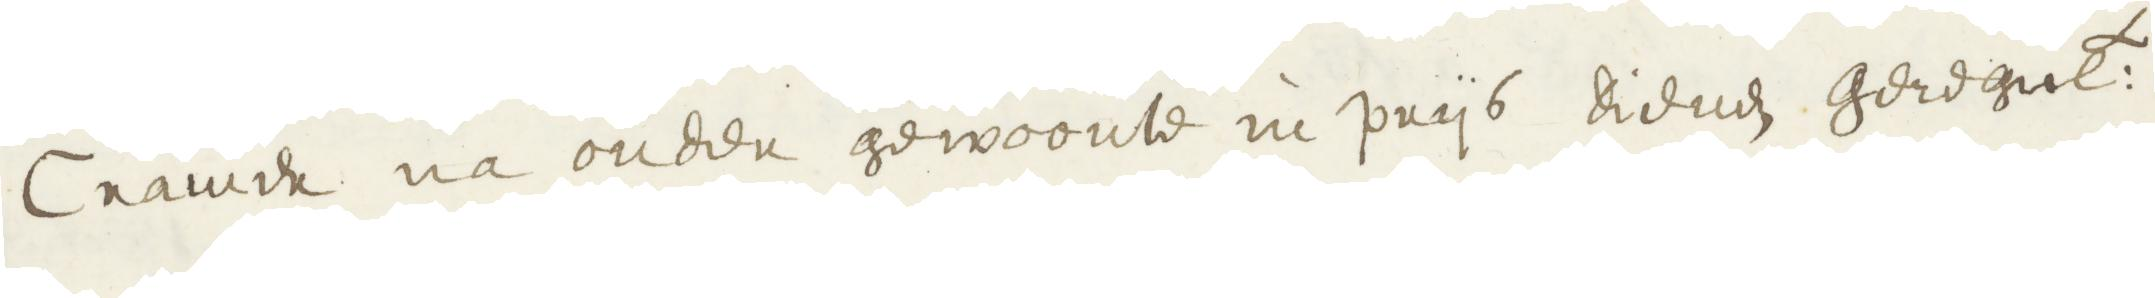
Cramer na ouder gewoonte in prijs dienen geregul:t
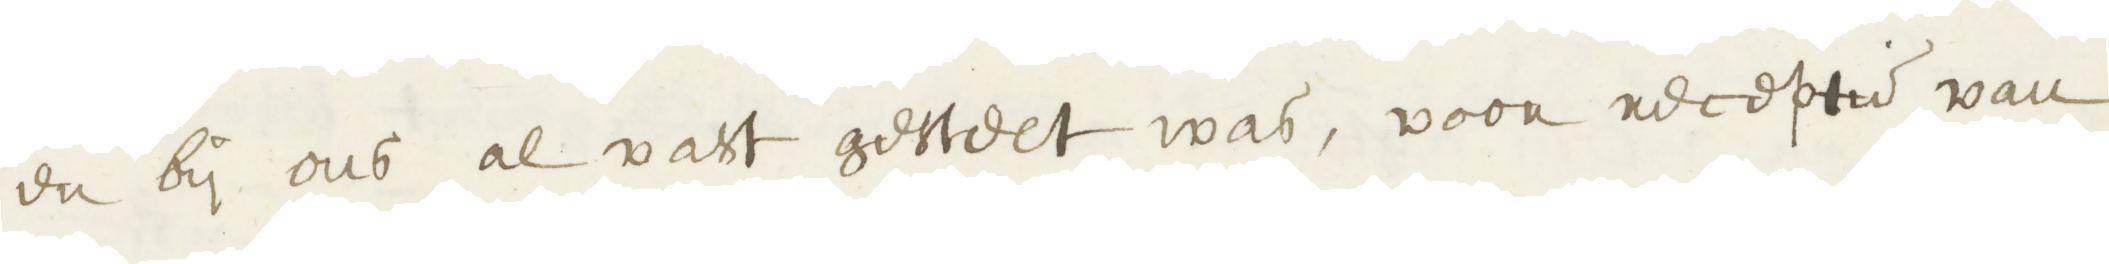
en bij ons al vast gestelt was, voor receptie van
